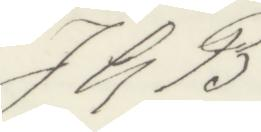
J G B
